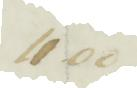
4.00
